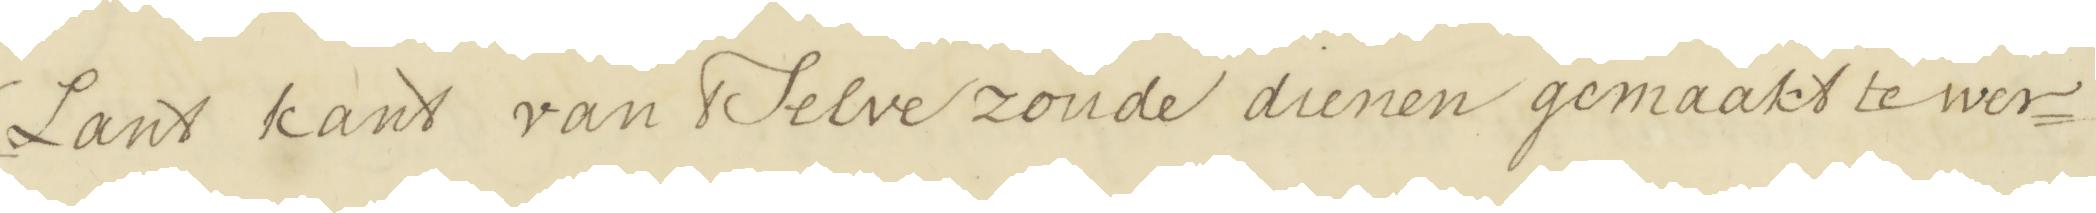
Lant kant van t Selve zoude dienen gemaakt te wer=
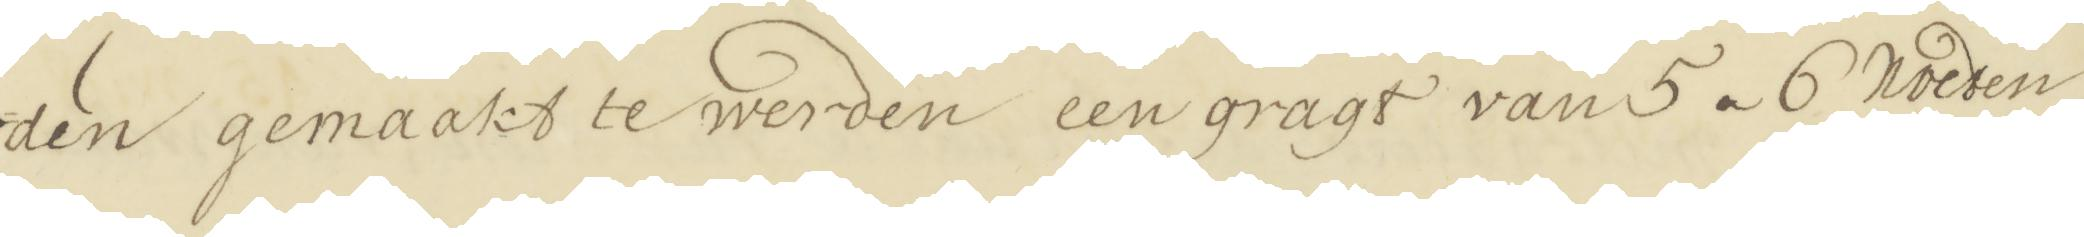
den gemaakt te werden een gragt van 5 a 6 roeden
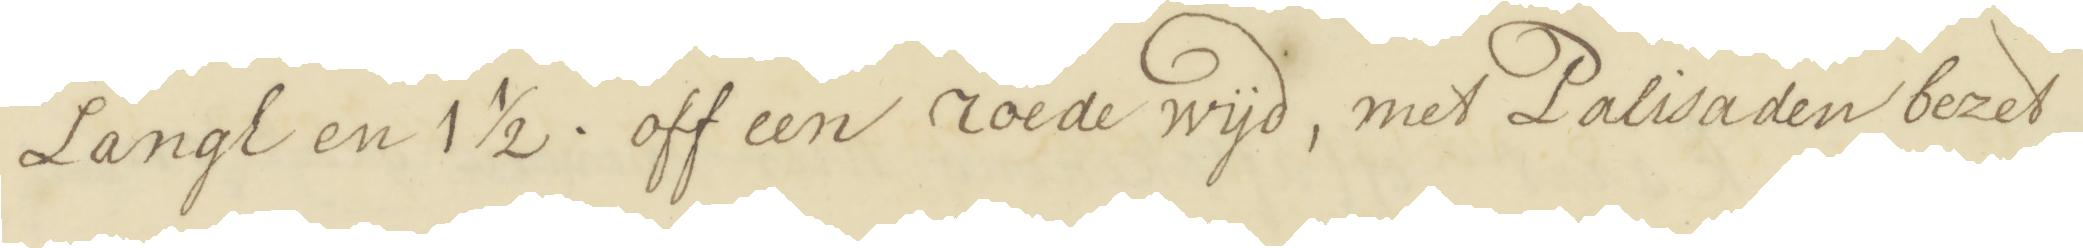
Langh en 1½. off een roede wijd, met Palisaden bezet
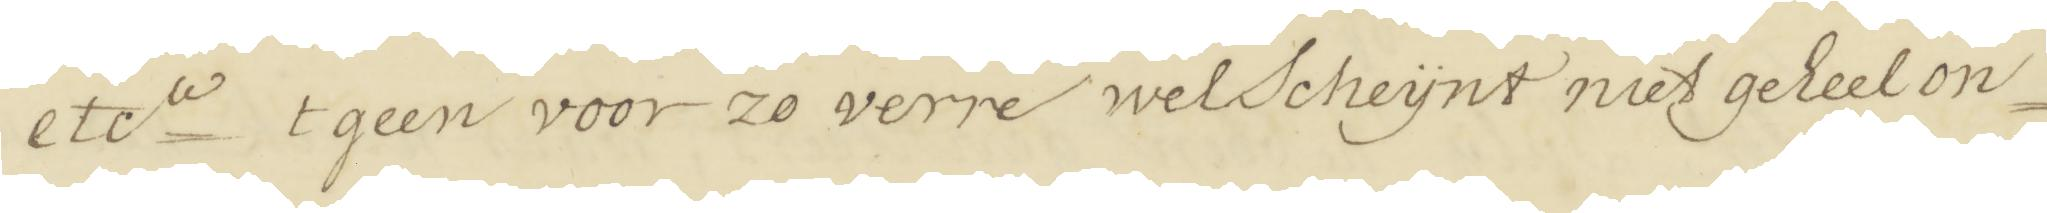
etc=a t geen voor zo verre wel Scheijnt niet geheel on=
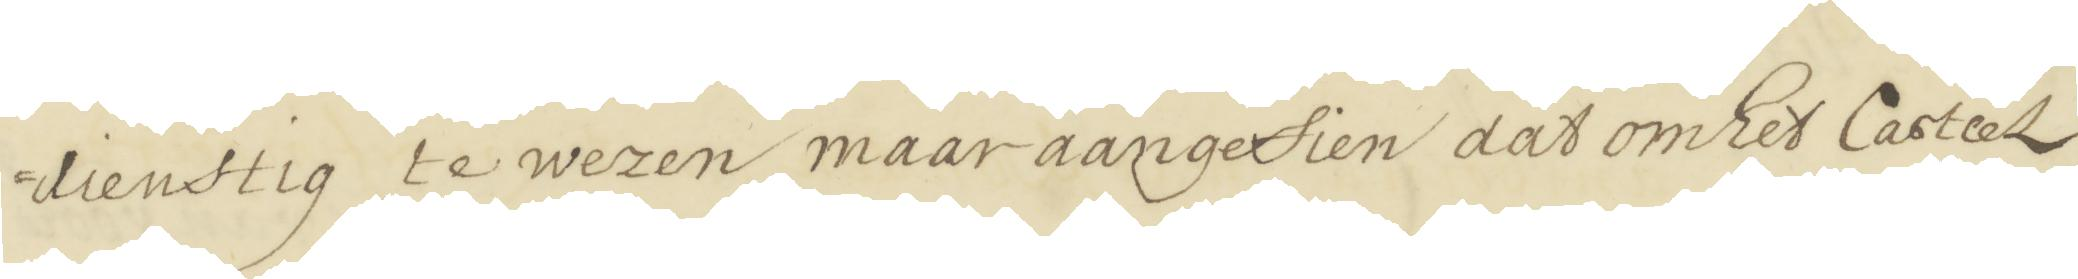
dienstig te wezen maar aangesien dat om het Casteel
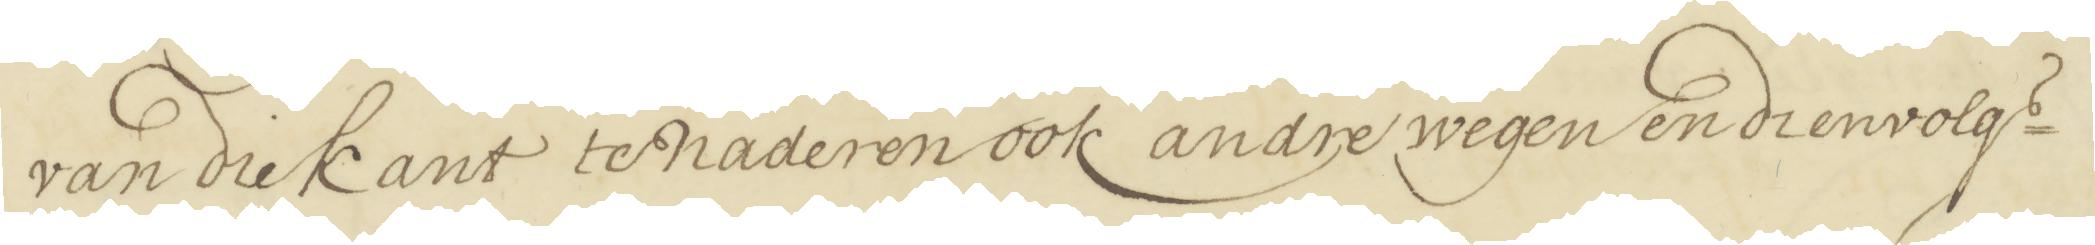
van die kant te naderen ook andre wegen en dienvolg=s
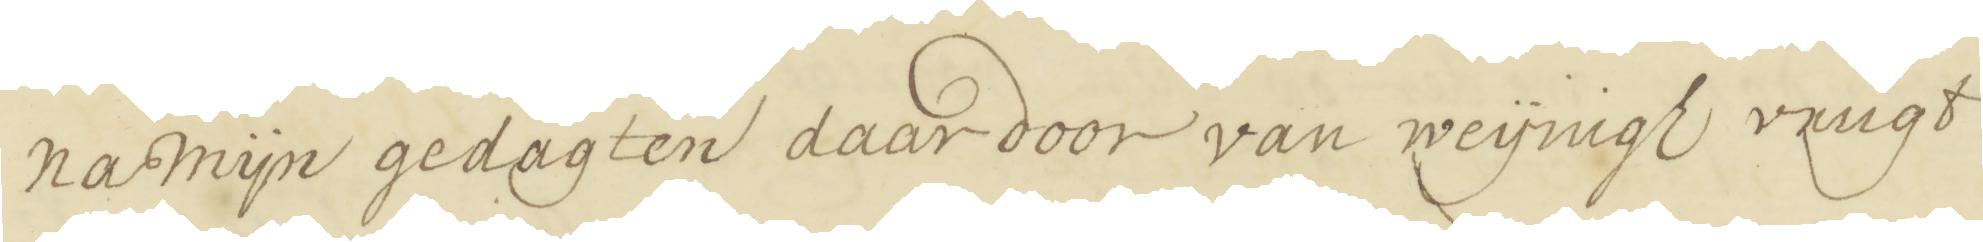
na mijn gedagten daar door van weijnigh vrugt
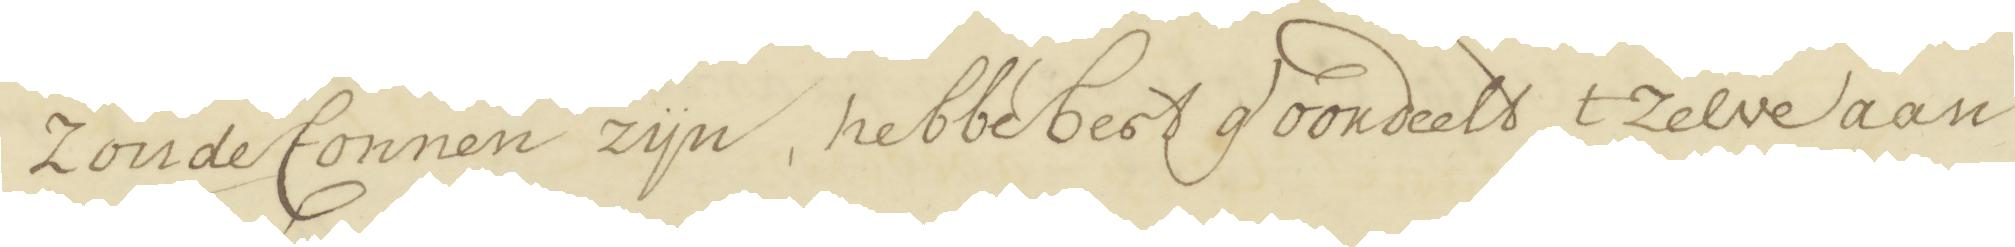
Zoude Connen zijn, hebbe best g’oordeelt t zelve aan
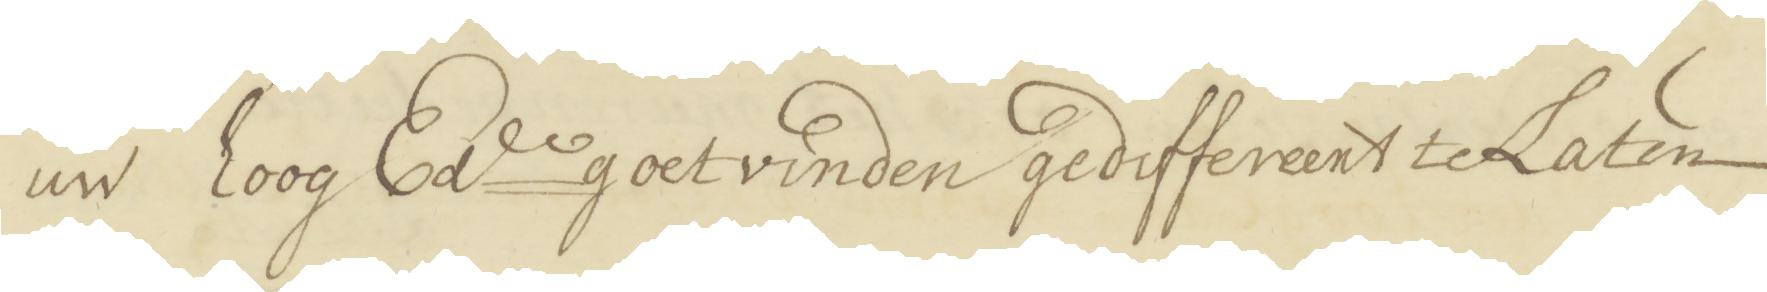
uw hoog Ed=le goet vinden gediffereert te Laten
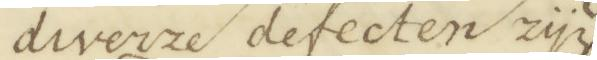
diverze defecten zijn
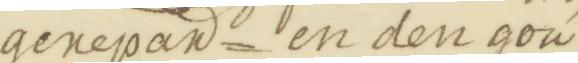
gerepar=d en den gou
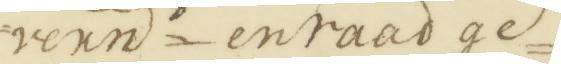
vern=r en raad ge=
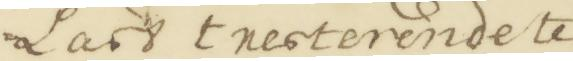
Last t resterende te
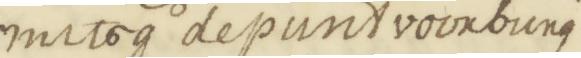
mitsgr:s de punt voorburg
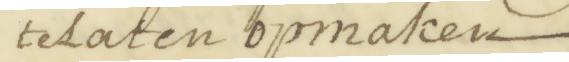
telaten opmaken
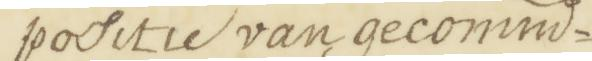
positie van gecomm=s
